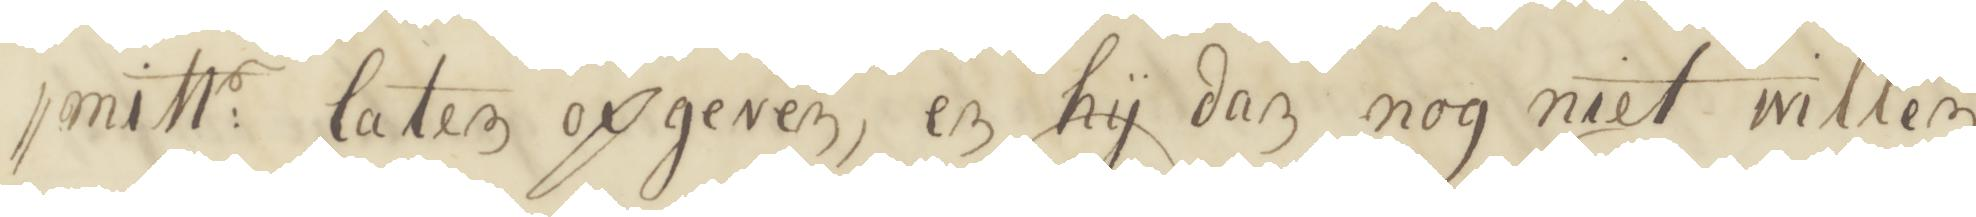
„mitt:s laten overgeven, en hij dan nog niet willen
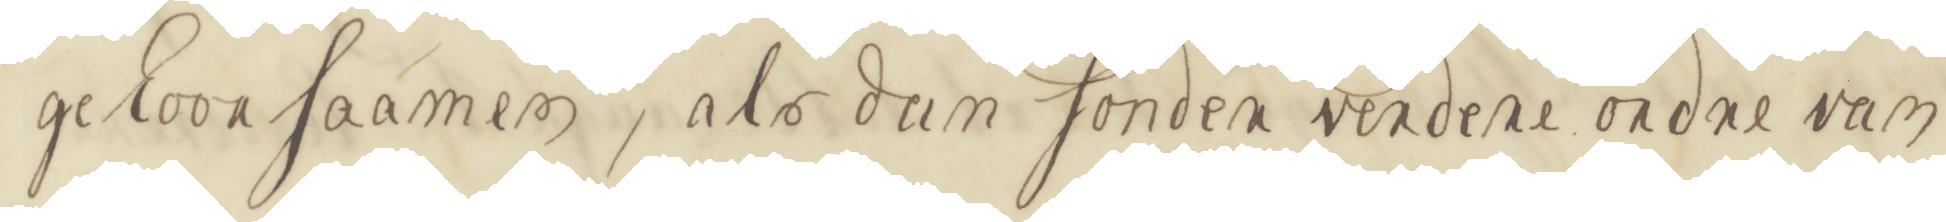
gehoor saamen, als dan sonder verdere ordre van
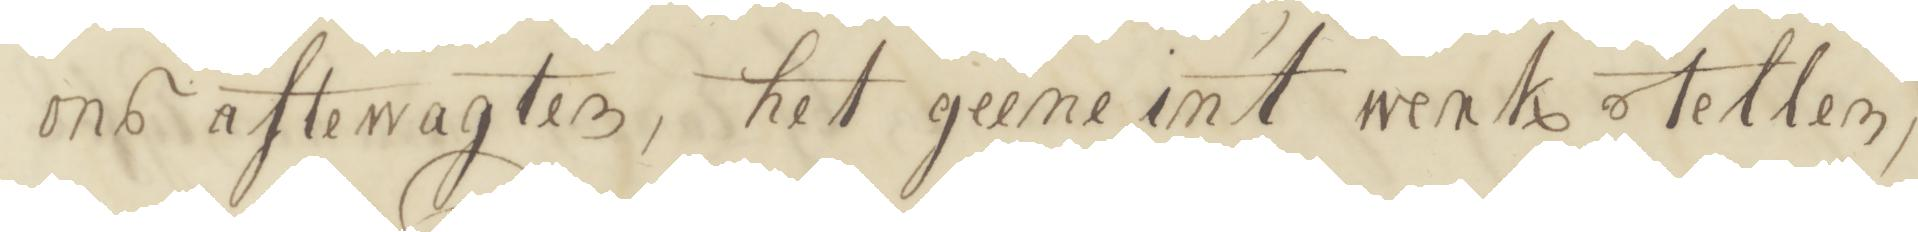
ons aftewagten, het geene in’t werk stellen,
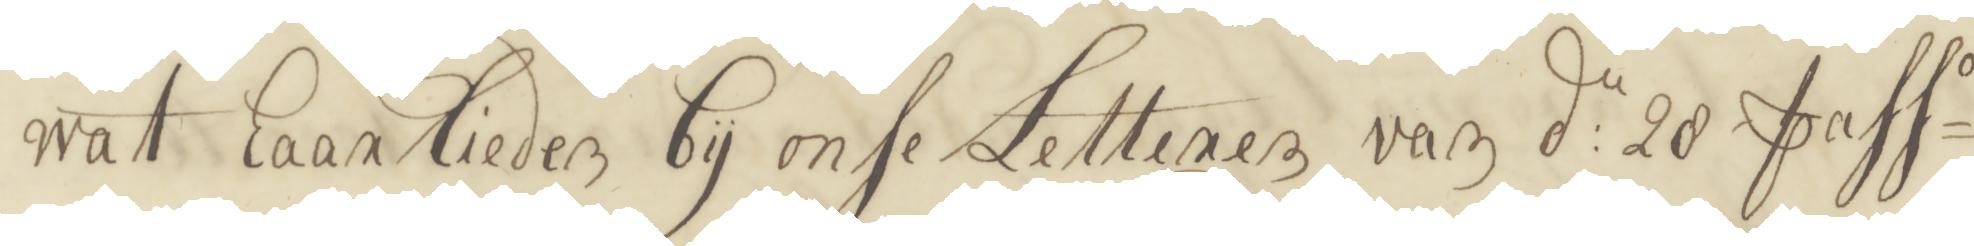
wat haar lieden bij onse Letteren van d:n 28 pass=o
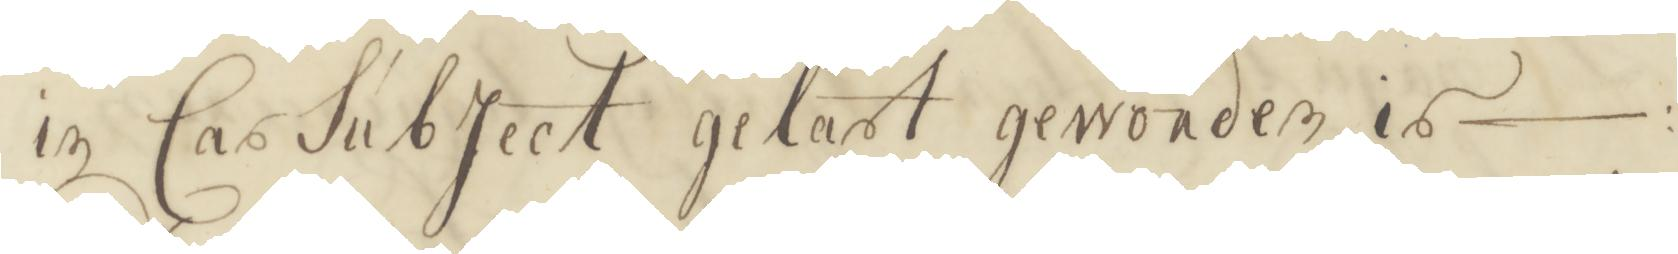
in Cas subject gelast geworden is —.
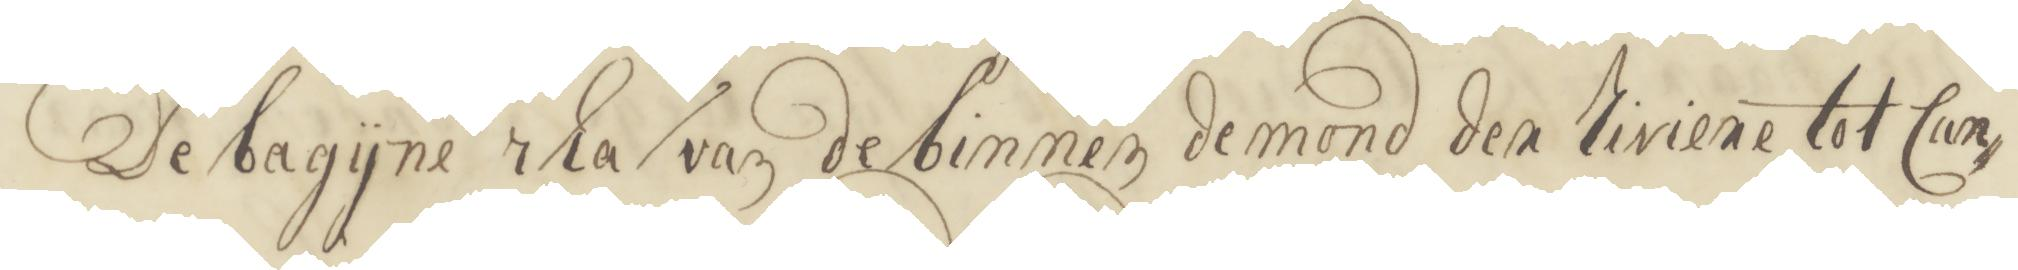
De bagijne rha van de binnen de mond der riviere tot Can„
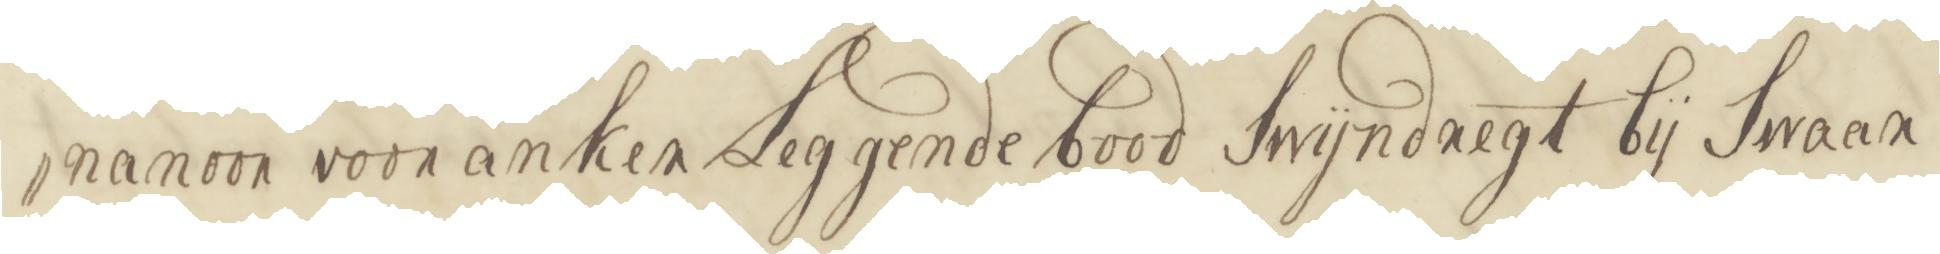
„nanoor voor anker leggende bood swijndregt bij swaar
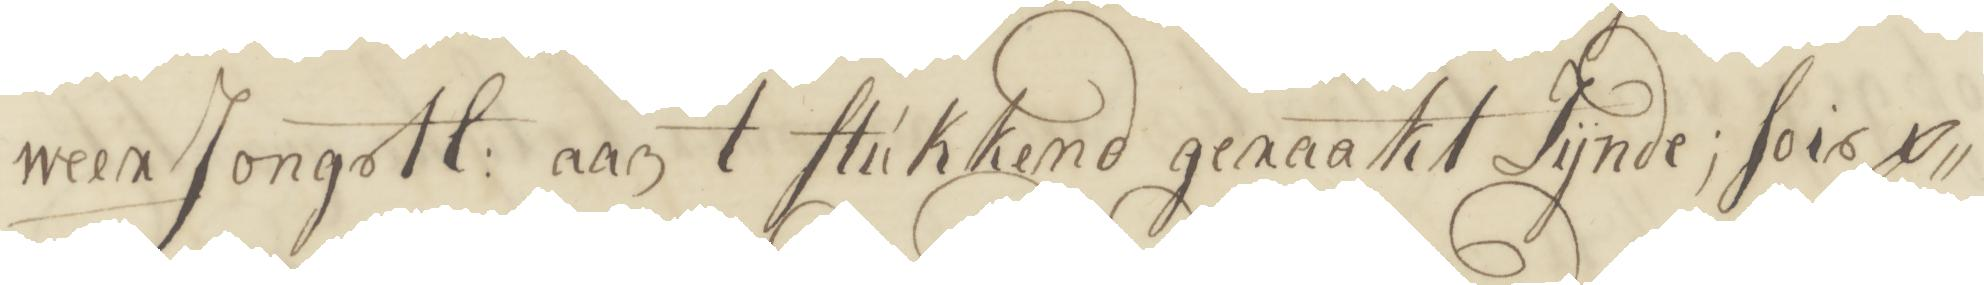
weer Jongstl: aan ’t stukkend geraakt zijnde; so is ver„
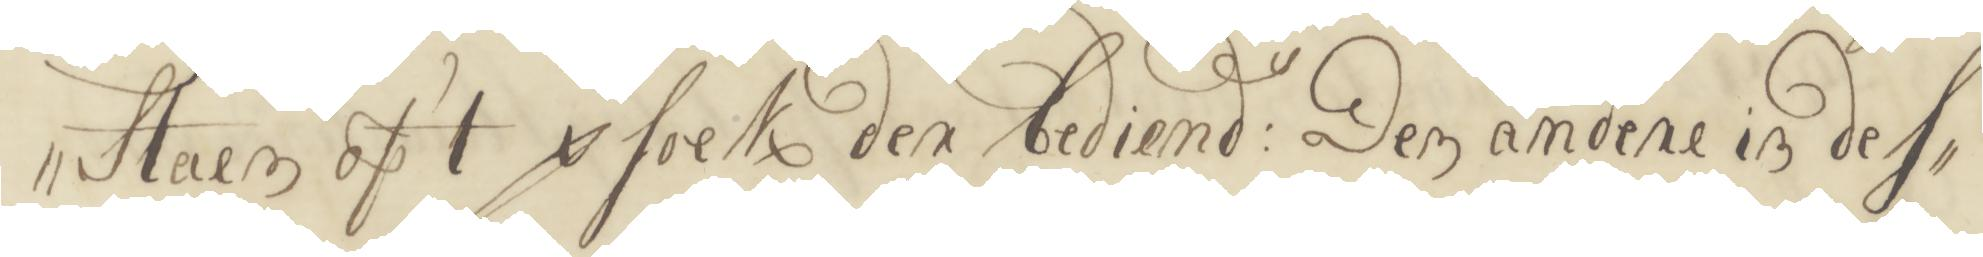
„staen of ’t versoek der bediend:s Een andere in des„
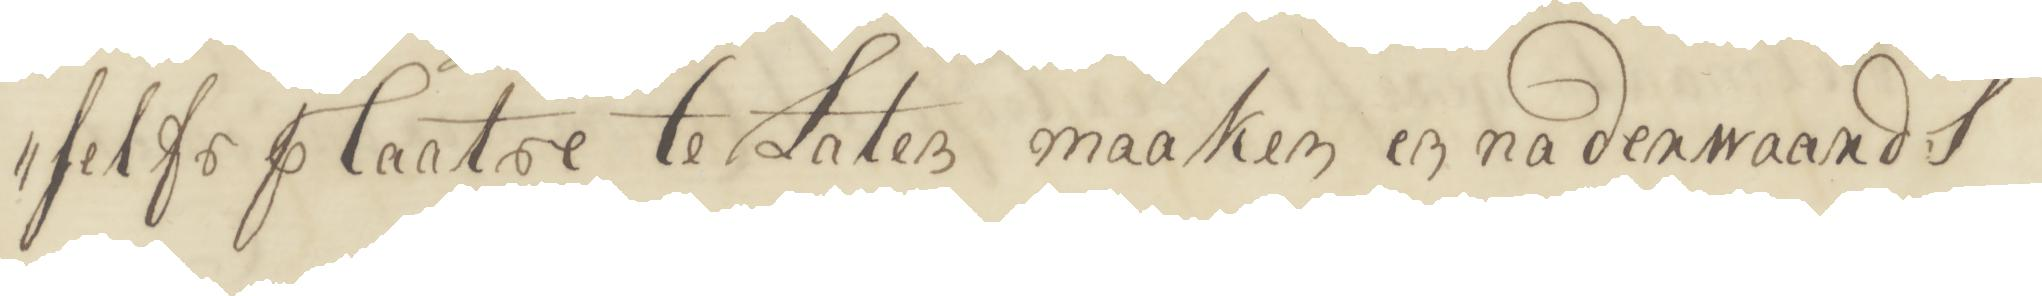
„selfs plaatse te laten maaken en na derwaards
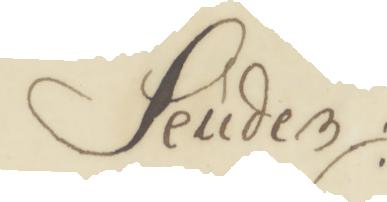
Seuden:
